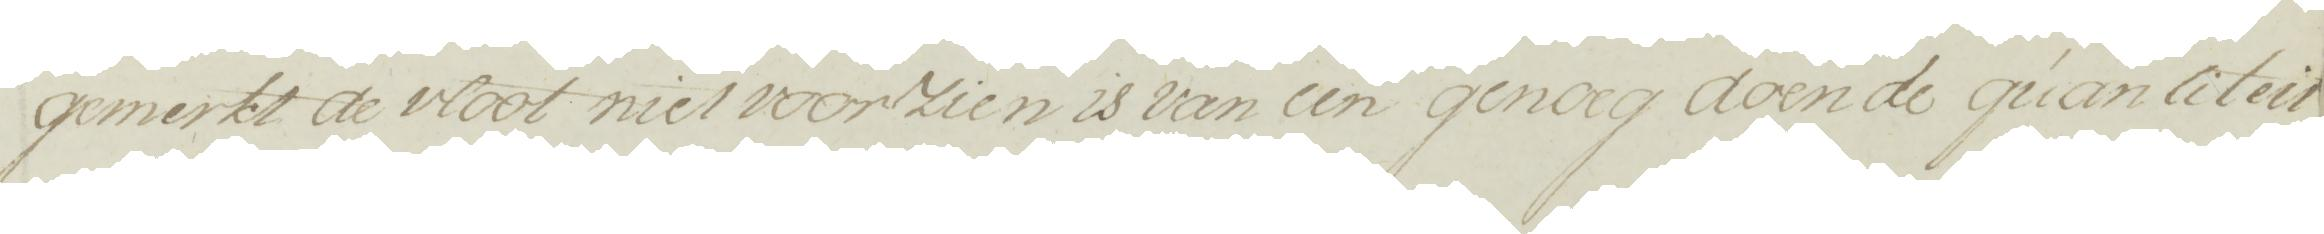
gemerkt de vloot niet voorzien is van een genoeg doende quantiteit
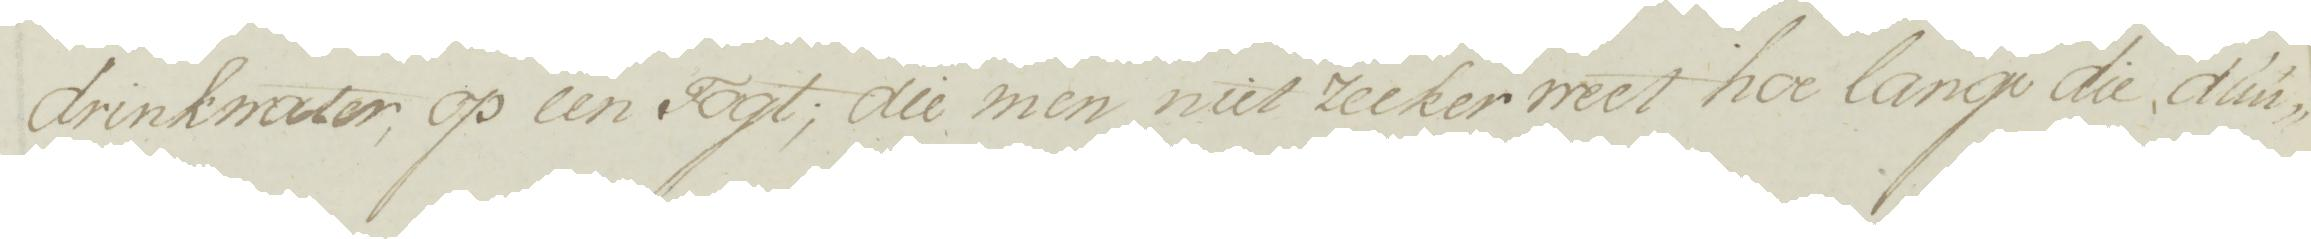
drinkwater, op een Togt; die men niet zeeker weet hoe lange die duu„
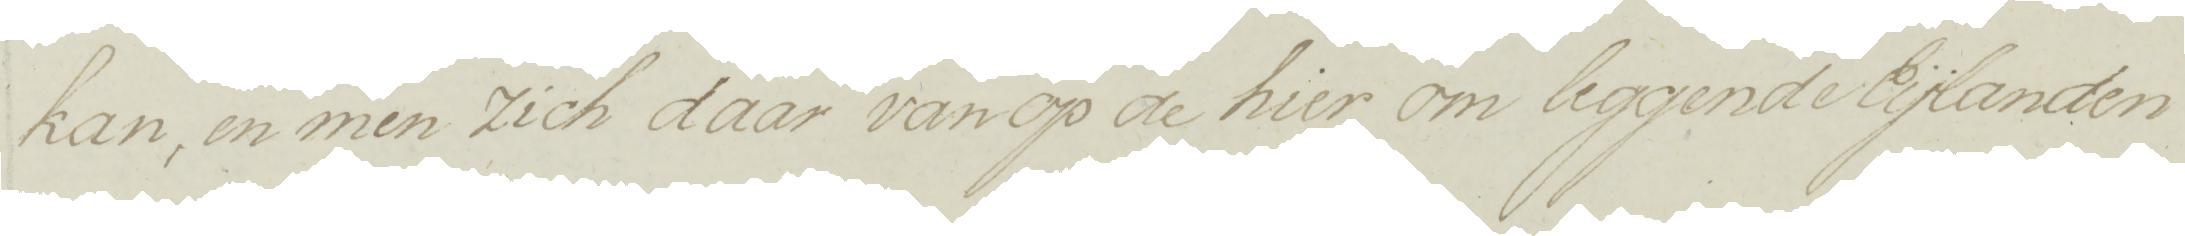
kan, en men zich daar van op de hier om leggende Eijlanden
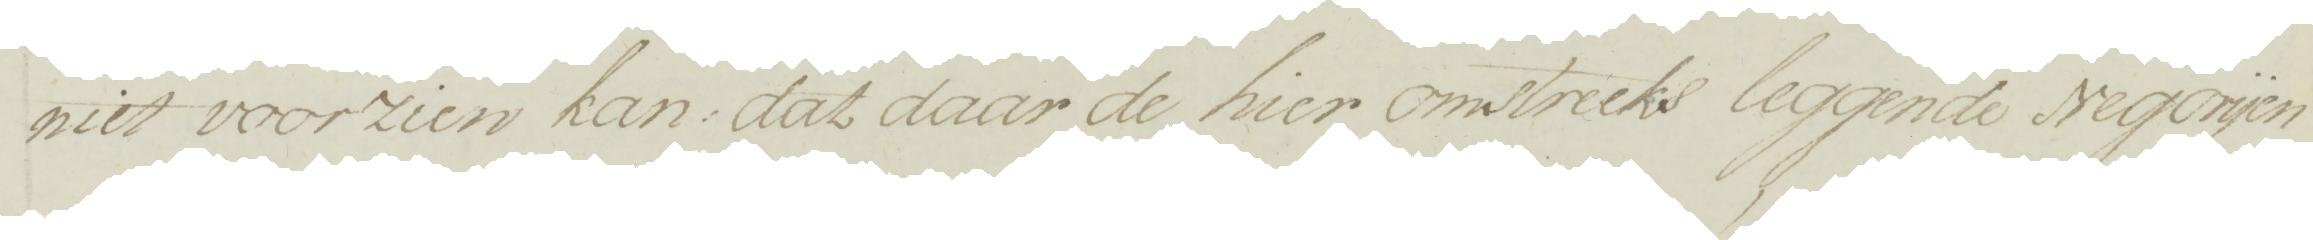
niet voorzien kan dat daar de hier omstreeks leggende negorijen
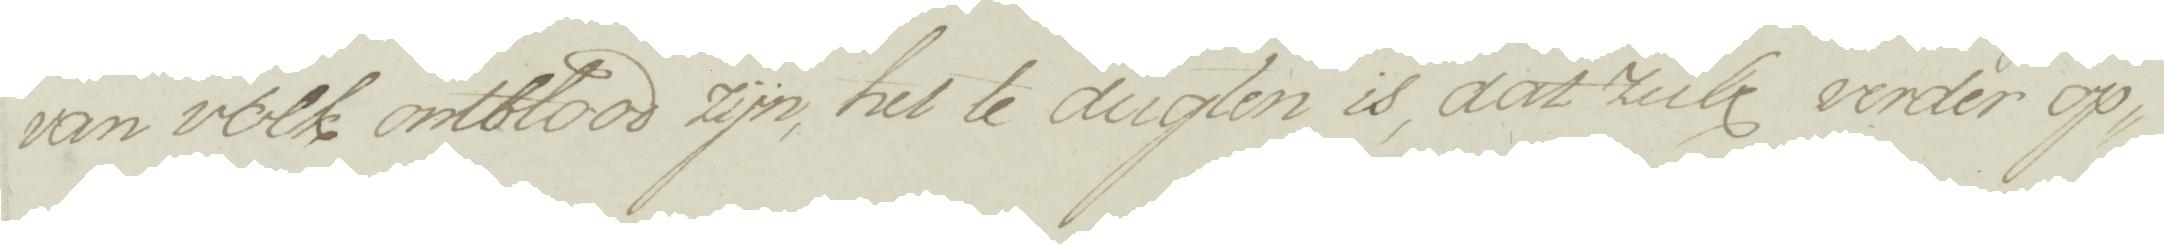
van volk ontblood zijn, het te dugten is, dat zulx verder op„
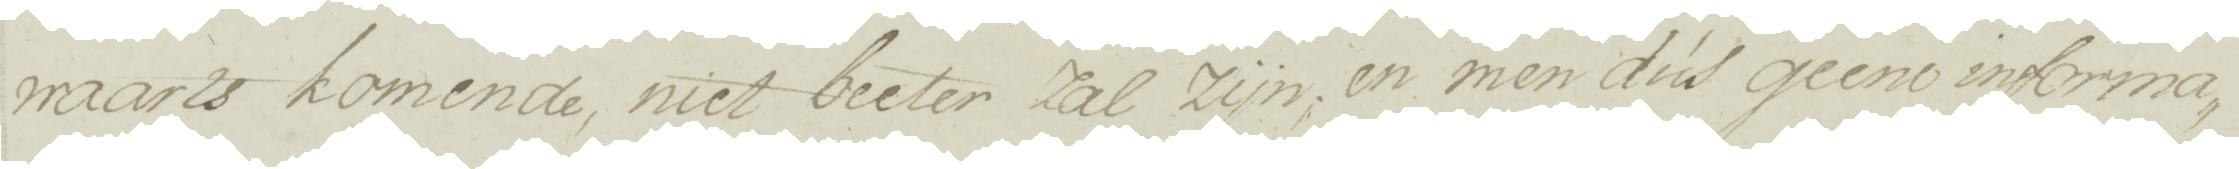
waarts komende, niet beeter zal zijn, en men dus geene informa„
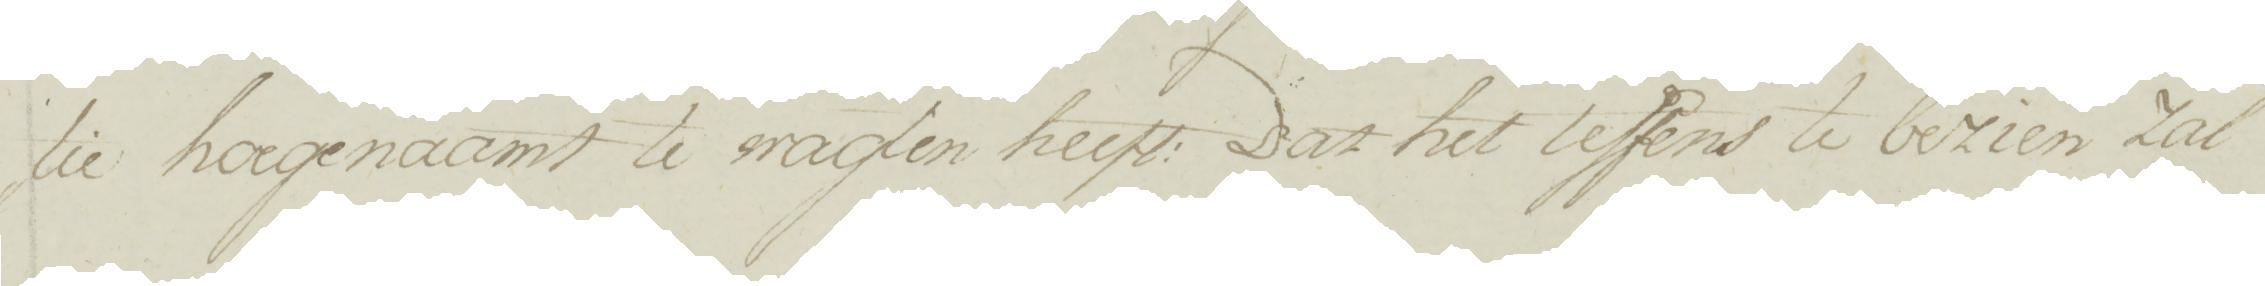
tie hoegenaamt te wagten heeft: Dat het teffens te bezien zal
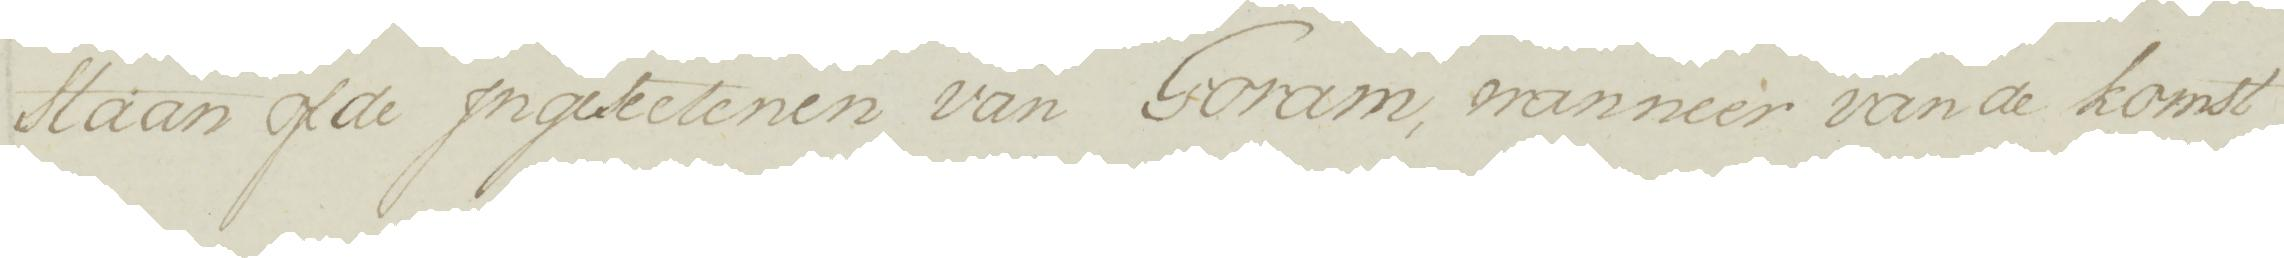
staan op de jngeseetenen van Goram, wanneer van de komst
